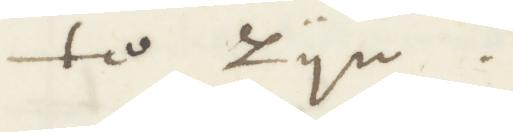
te zijn -
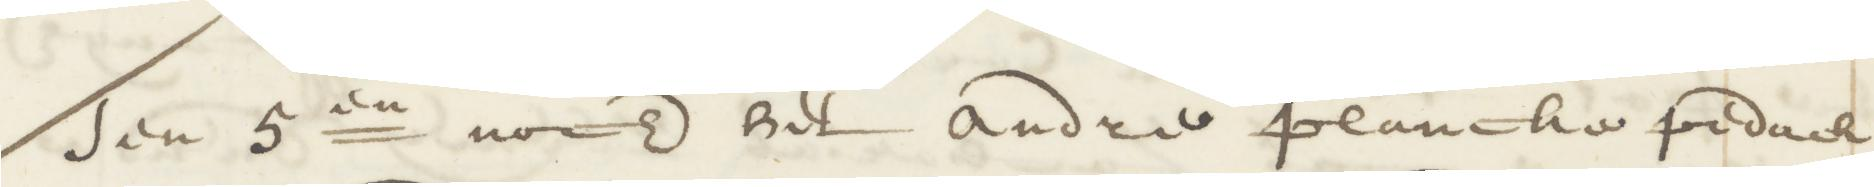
Ten 5=en noch het andre plancke pedack
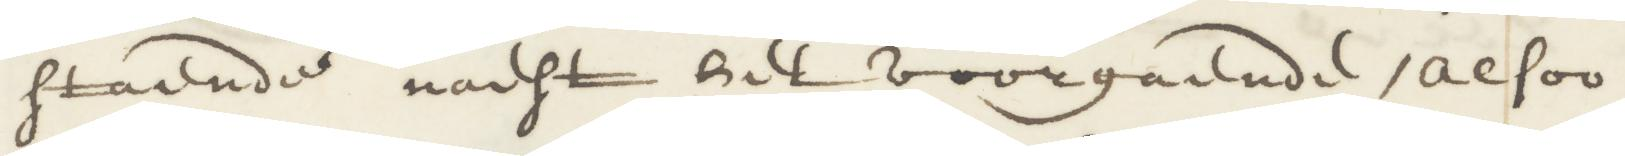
staende naest het voorgaende, alsoo
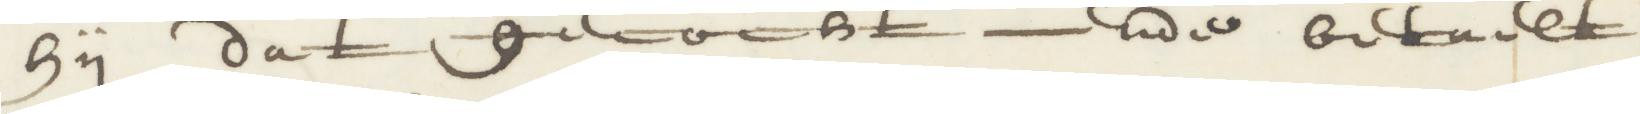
hij dat gecocht ende betaelt
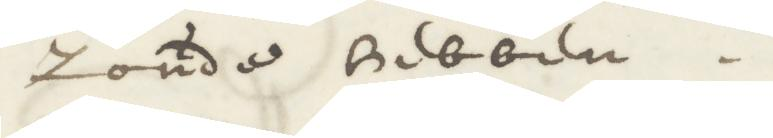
zoude hebben -
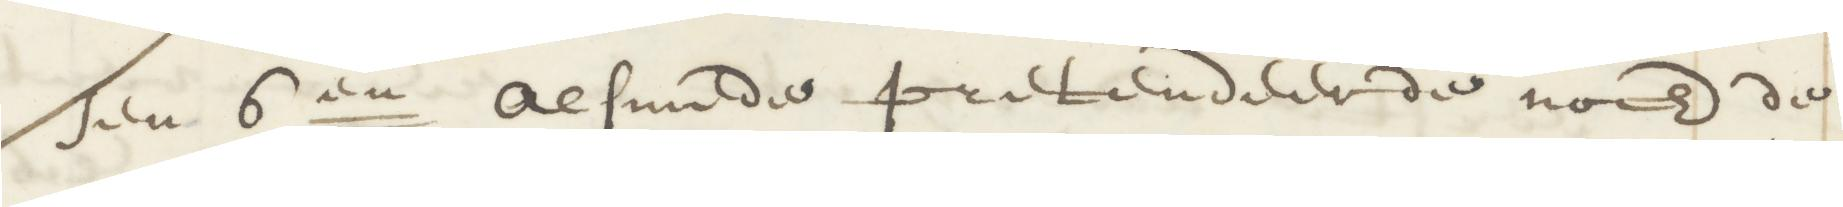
Ten 6=en alsmede pretendeerde noch de
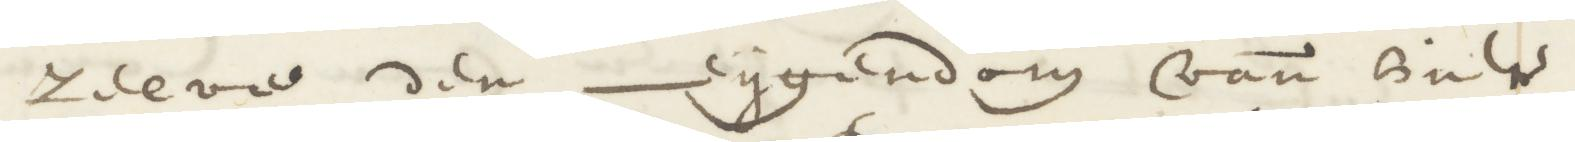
zelve den eijgendom van hier
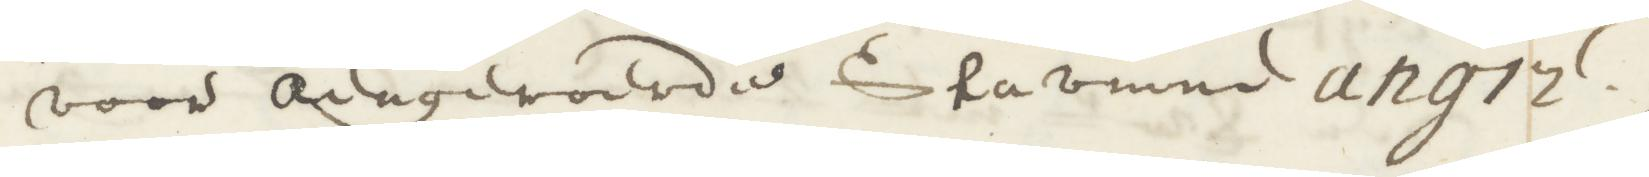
voor aengevoerde Slavinne angie -
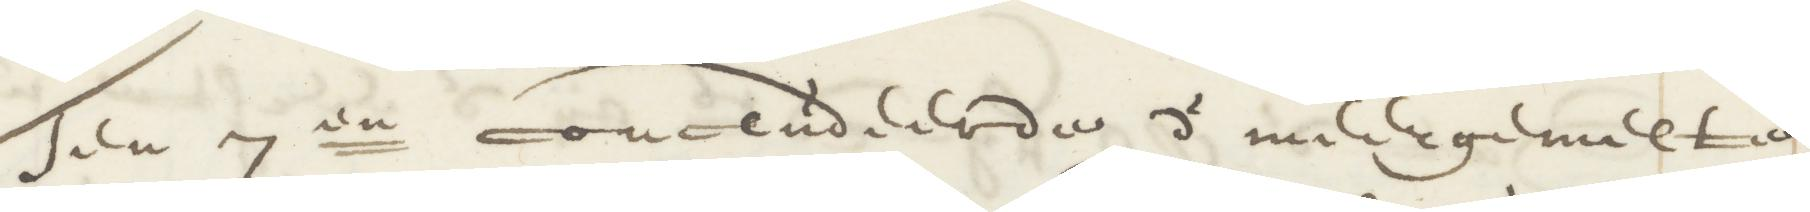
Ten 7=en concludeerde d’ meergemelte
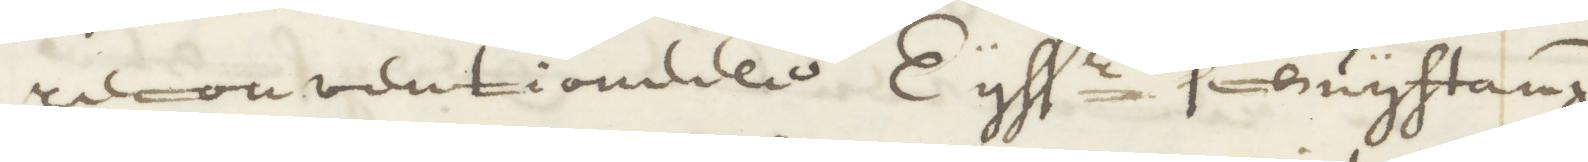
reconventioneele Eijss=r schuijftang
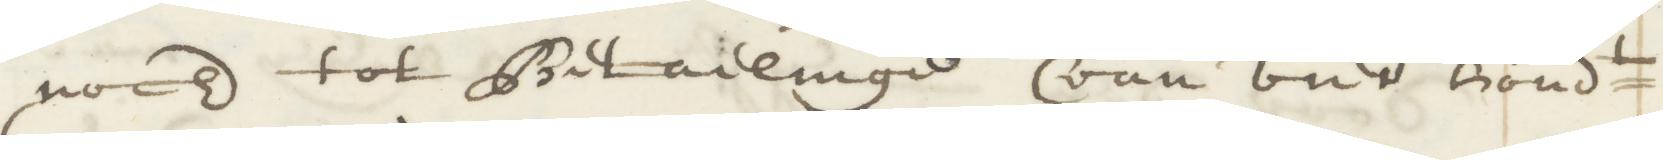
noch tot Betaelinge van vier hond=t
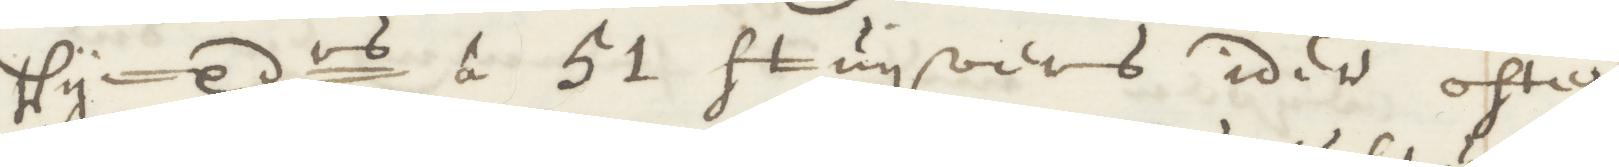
Rijcxd=rs â 51 stuijvers ider ofte
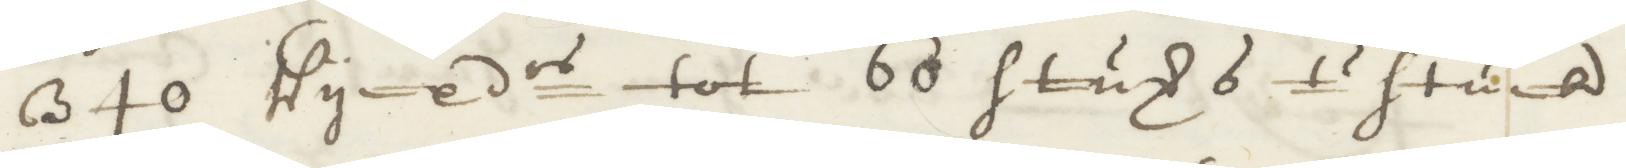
310 Rijcxd=rs tot 60 stuvers t' stuck
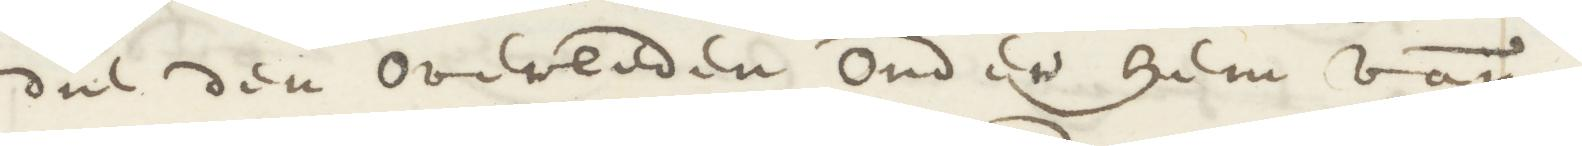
die den overleden onder hem van
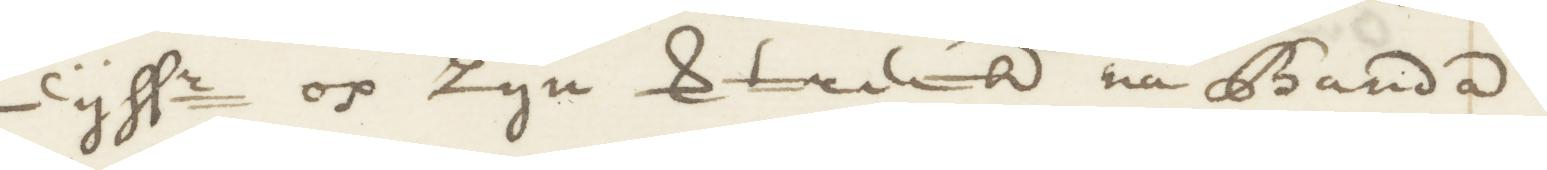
eijss=r op zijn vertreck na Banda
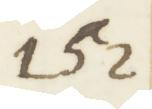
152
